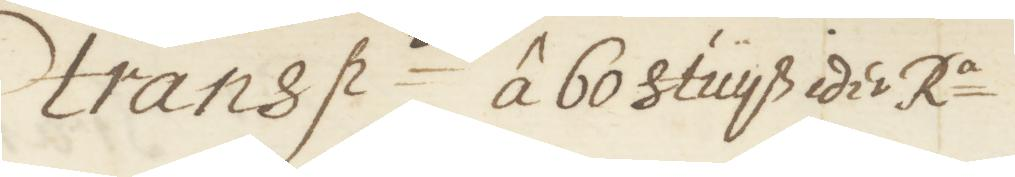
P=r transp=t â 60 stuijver ider R=a
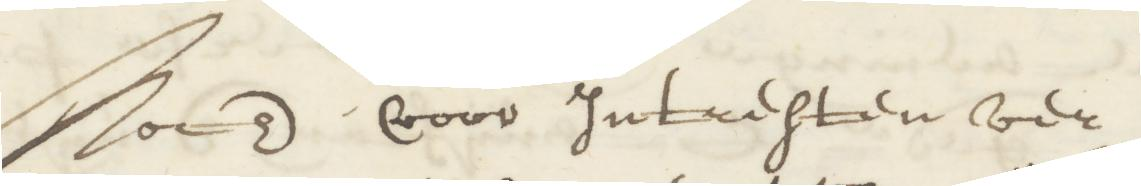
Noch voor Jntresten ver
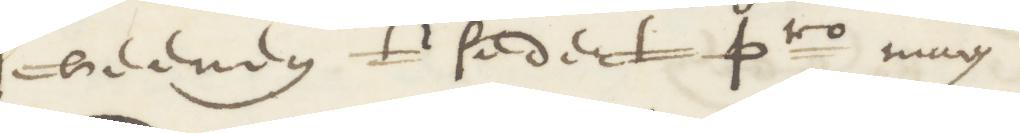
scheenen t' sedert p=ro maey
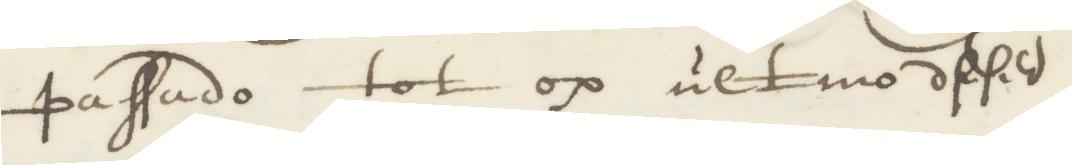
passado tot op ultmo deser
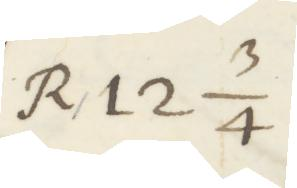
R 12¾
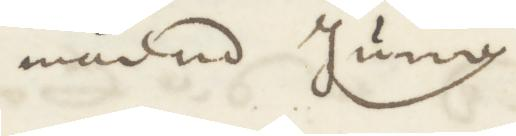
maend Juny
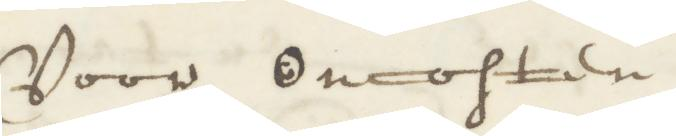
Voor Oncosten
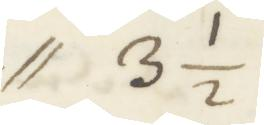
„ 3½
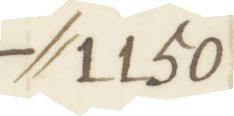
—„1150
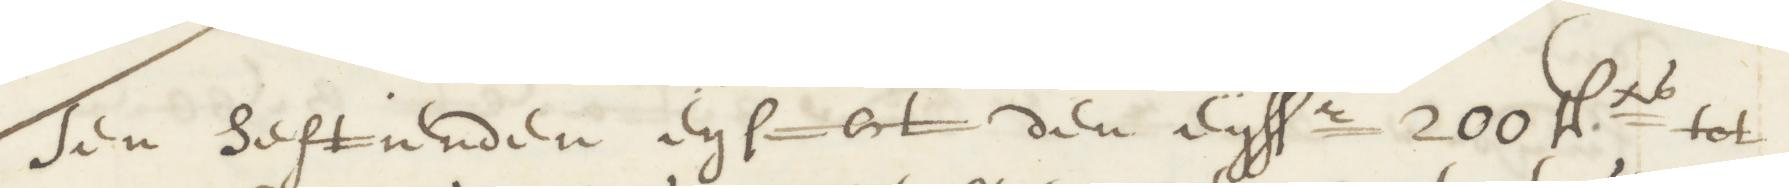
Ten sestienden eijscht den Eijss=r 200 R=xs tot
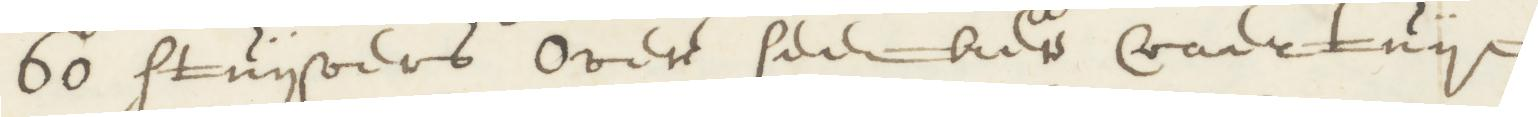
60 stuijvers Over seecker vaertuijch
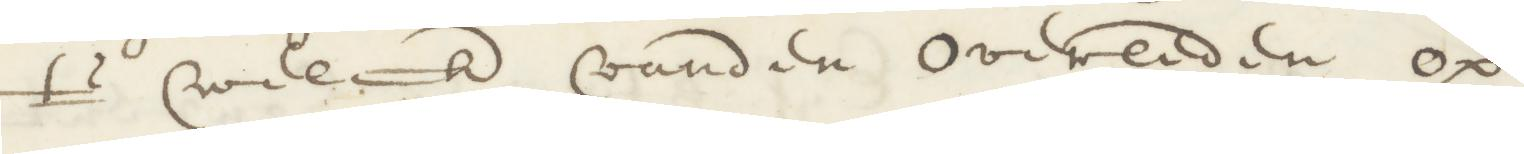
t welck vanden overleden op
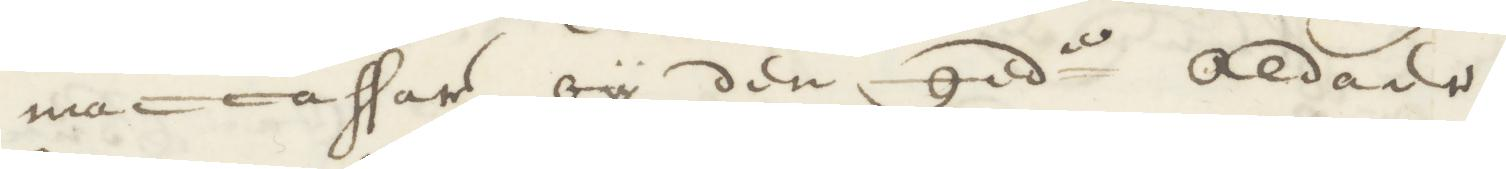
maccassar bij den ged=e Aldaer —
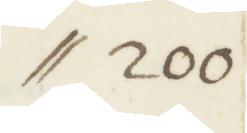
„ 200
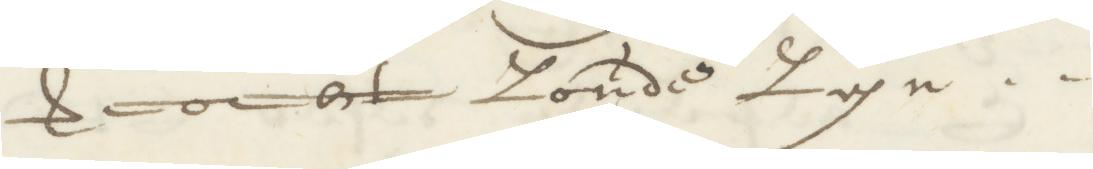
vercocht zoude zijn - -
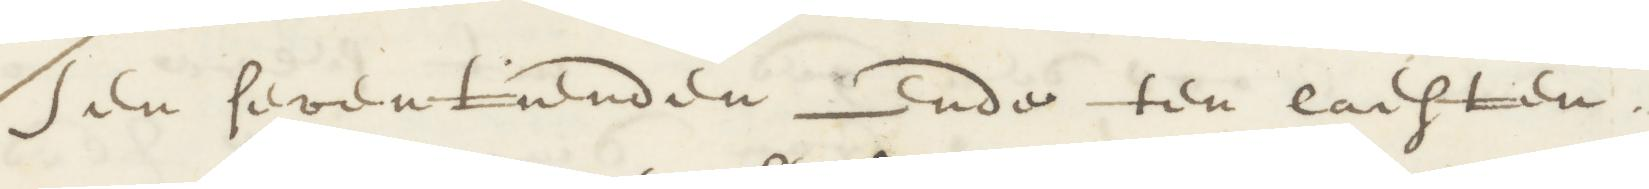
Ten seventienden Ende ten laesten.
